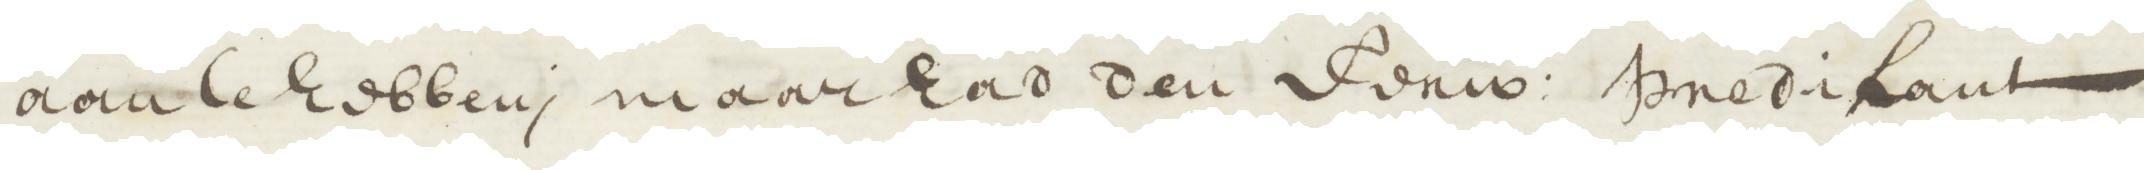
aan te hebben, maar had den Eerw: predikant
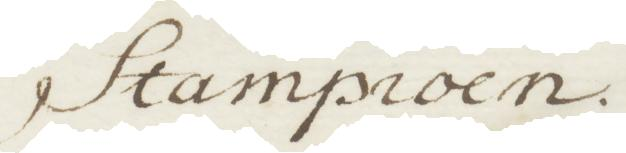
Stampioen
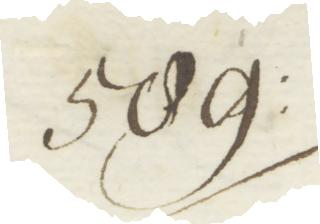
589:
